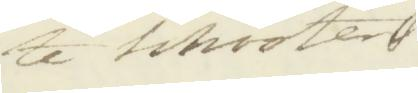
te Schooten
